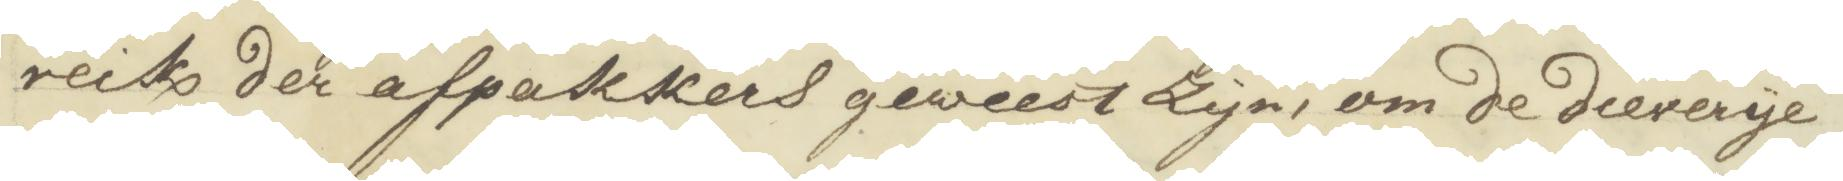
reik der afpakkers geweest zijn, om de dieverije
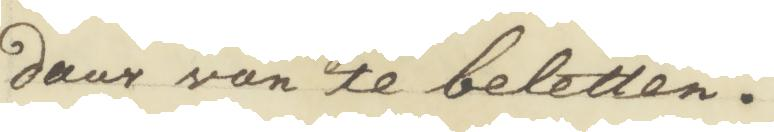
daar van te beletten.
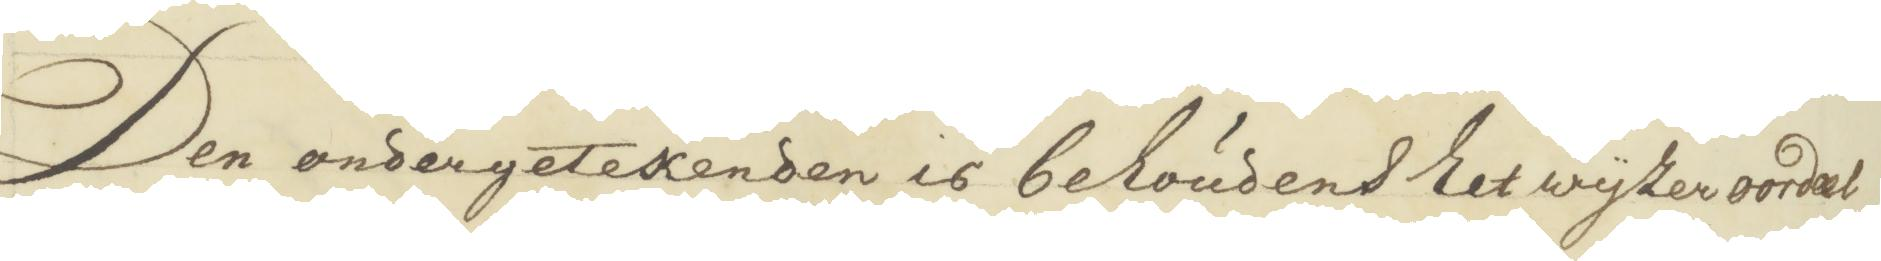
Den ondergetekenden is behoudens het wijzer oordeel
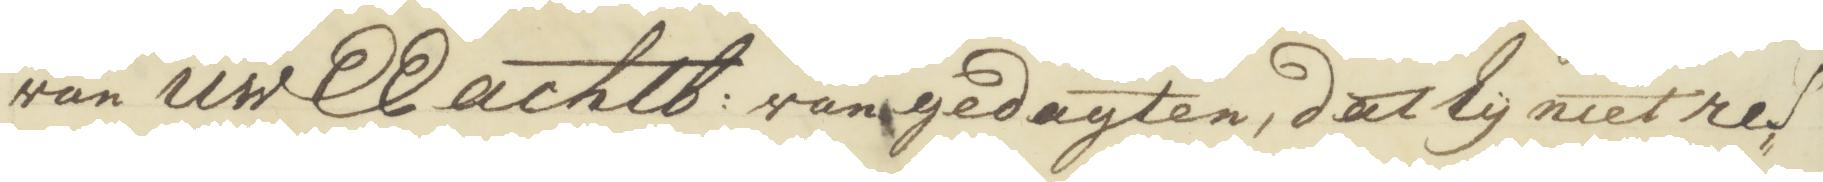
van uw EE achtb: van gedagten, dat hij niet res„
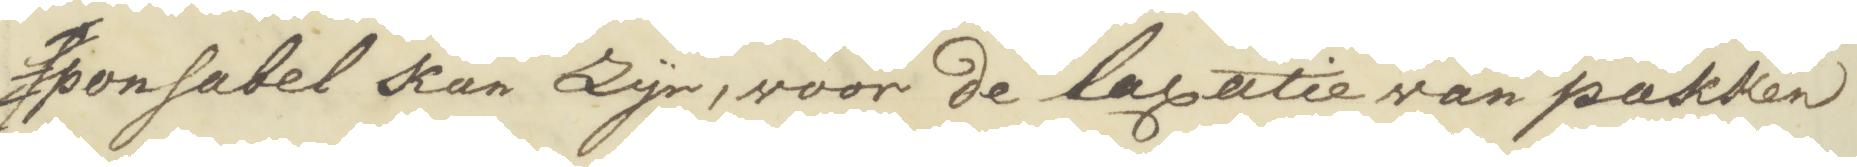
sponsabel kan zijn, voor de laxatie van pakken
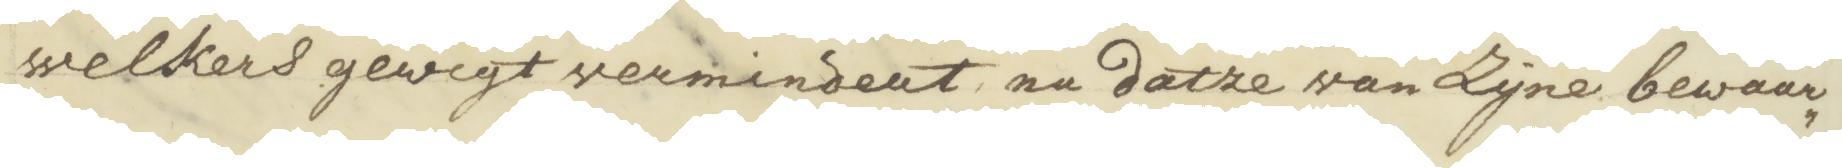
welkers gewigt vermindert, na datze van zijne bewaar„
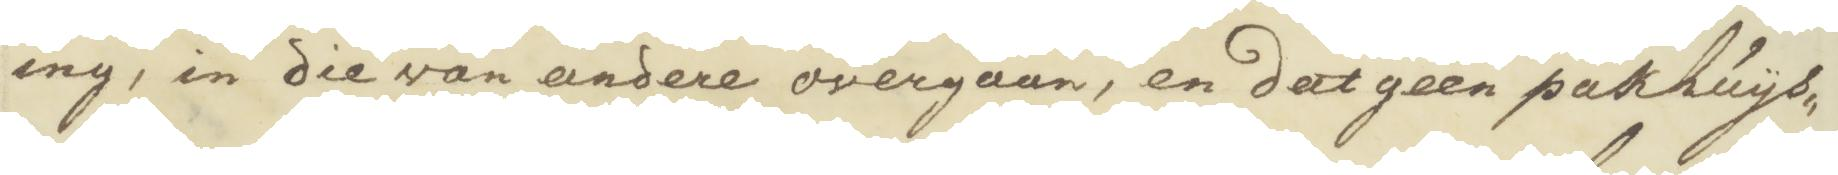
ing, in die van andere overgaan, en dat geen pakhuijs„
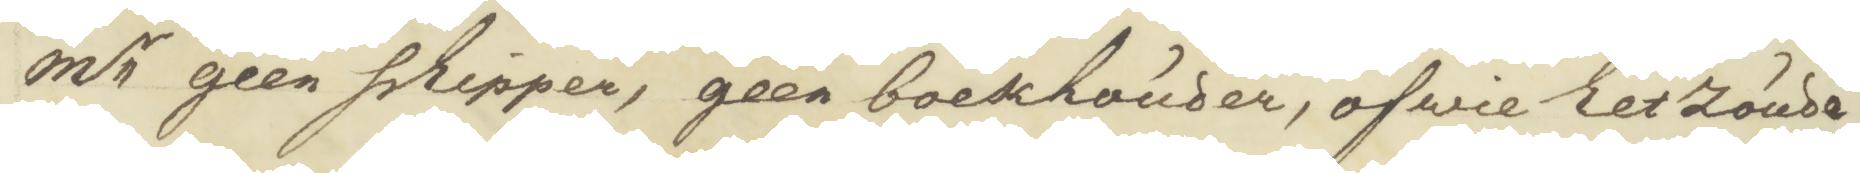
m„r geen schipper, geen boekhouder, of wie het zoude
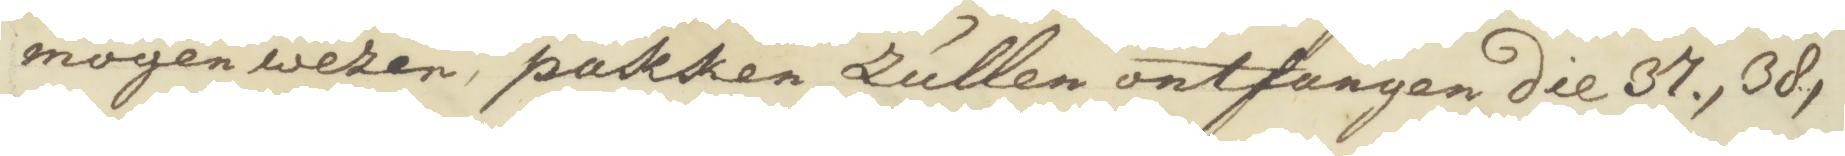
mogen wezen, pakken zullen ontfangen die 37., 38.,
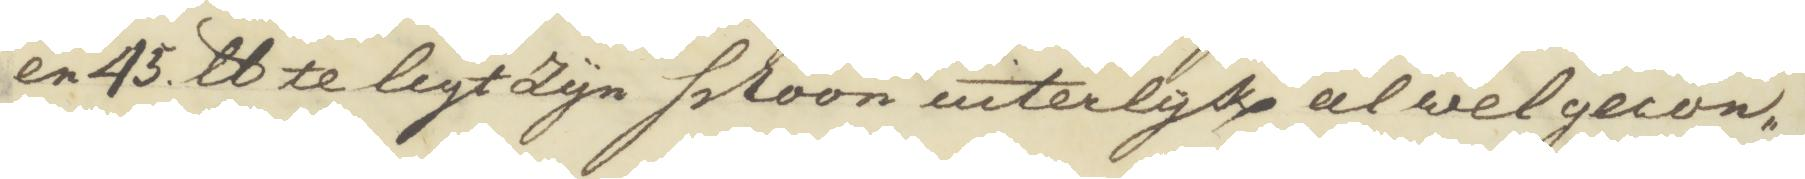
en 45. lb te ligt zijn schoon uiterlijk al wel gecon„
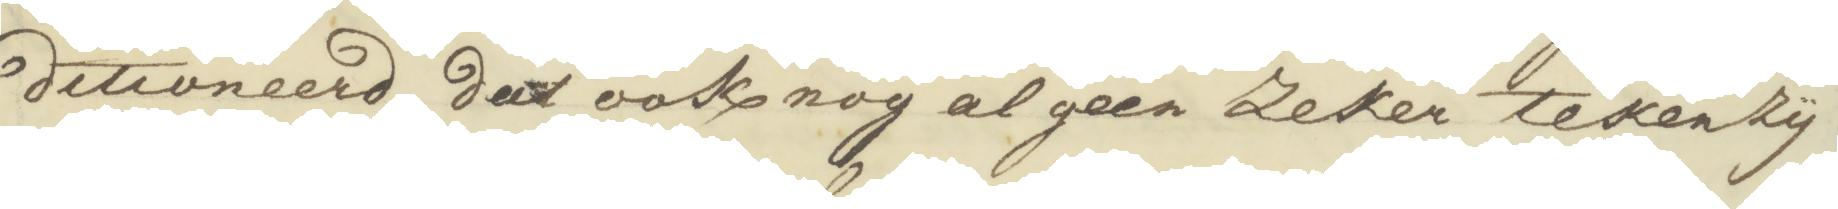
ditioneerd, dat ook nog al geen zeker teken zij
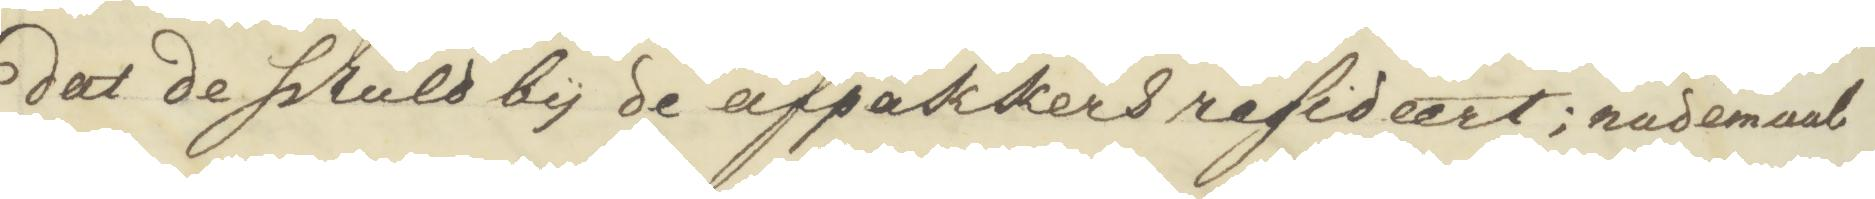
dat de schuld bij de afpakkers resideert; nademaal
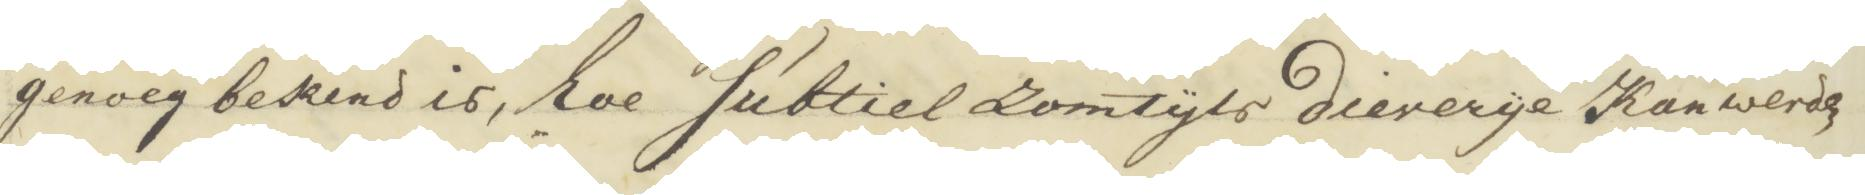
genoeg bekend is, hoe subtiel zomtijts dieverije kan werden
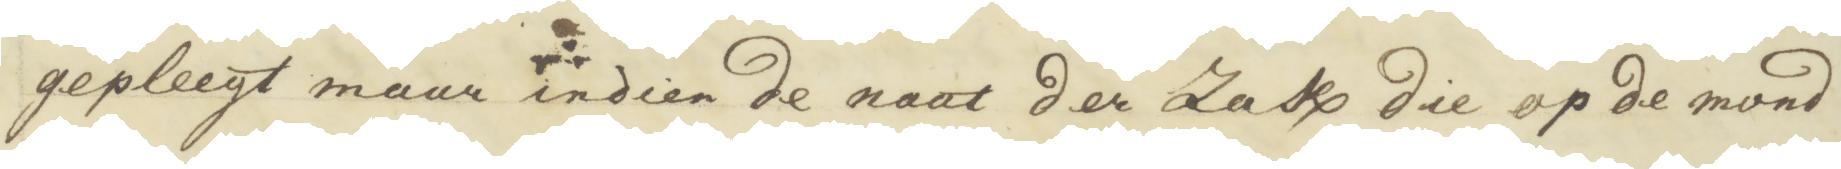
gepleegt maar indien de naat der zak die op de mond
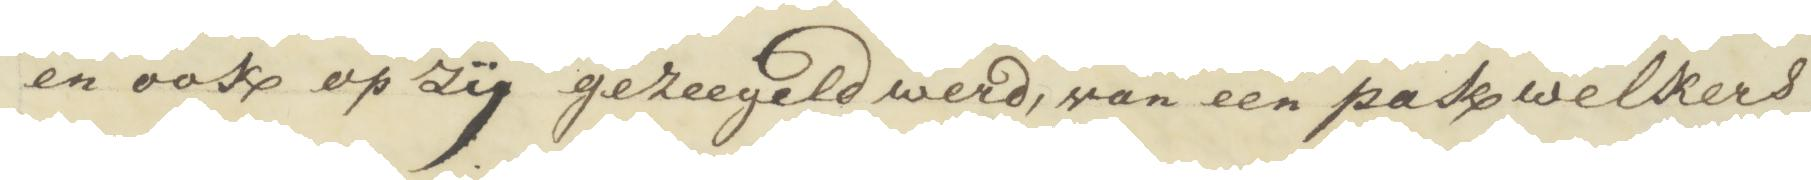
en ook op zig gezeegeld werd, van een pak welkers
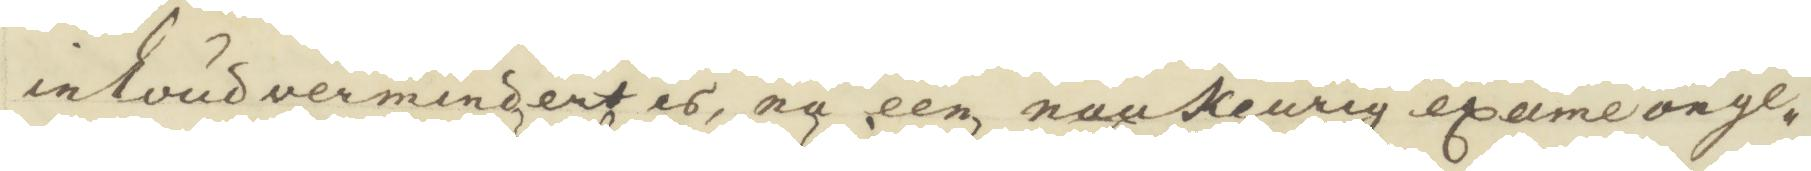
inhoud vermindert is, na een naakeurig exame onge„
